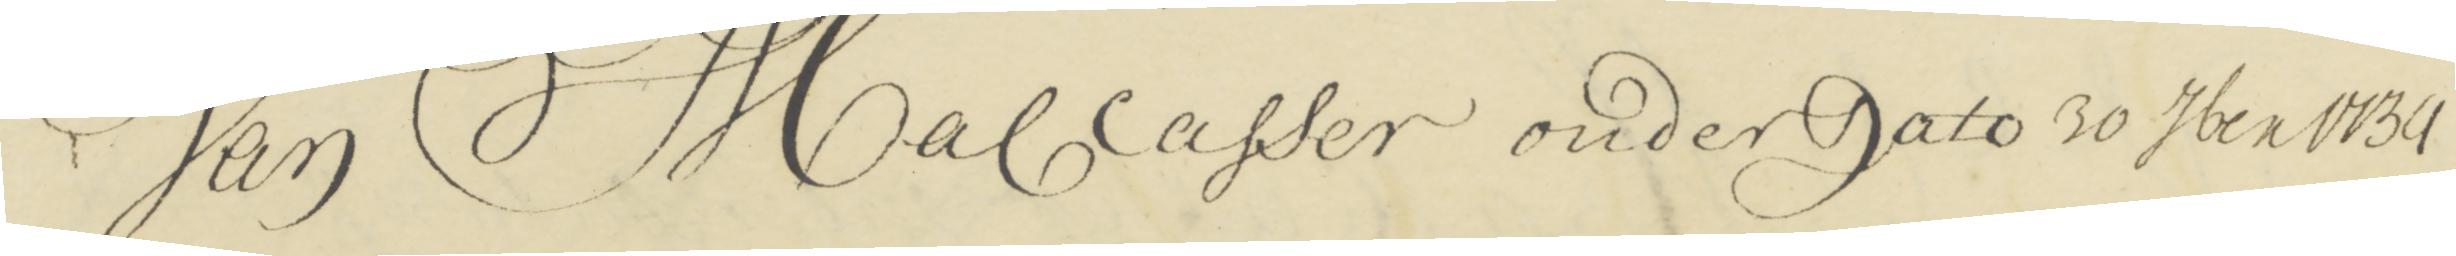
Van Maccasser onder Dato 30 7ber 1734
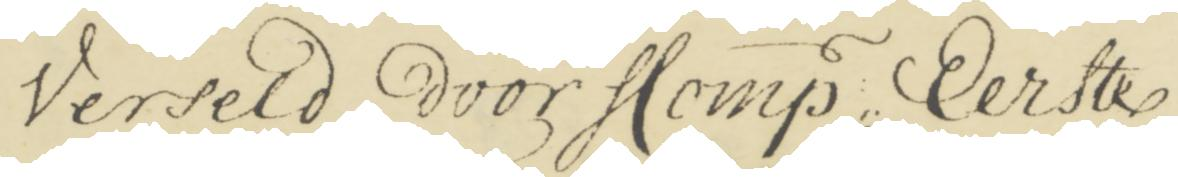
Verseld door sComp:s Eerste
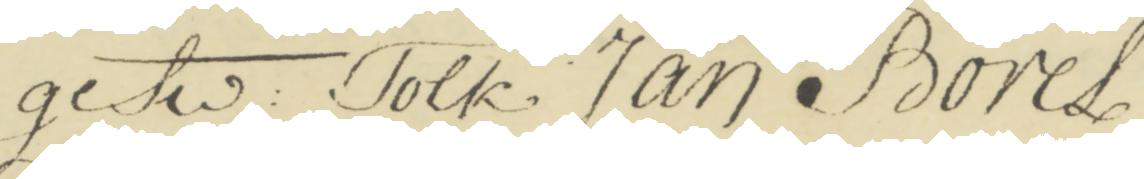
gesw: Tolk Jan Borel
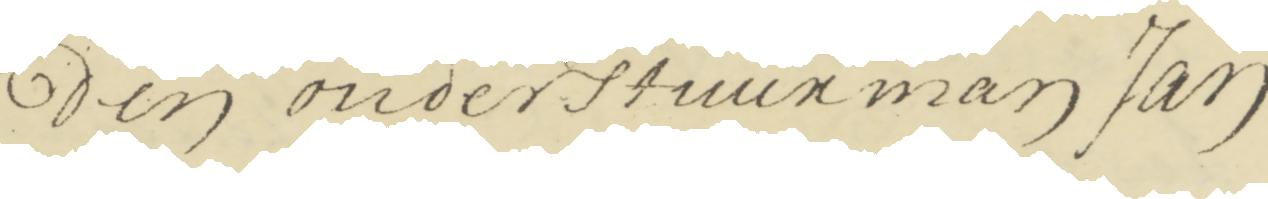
den onderstuurman Jan
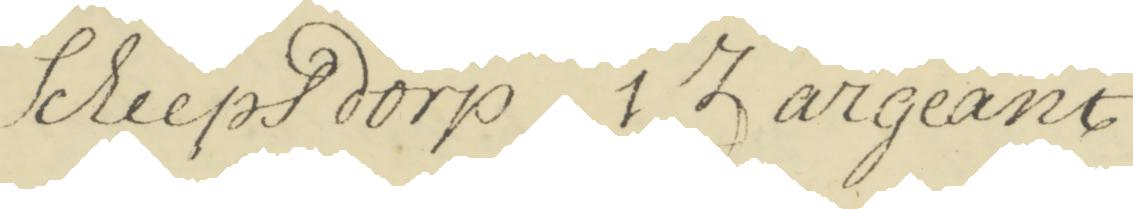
scheepsdorp, 1 Zargeant
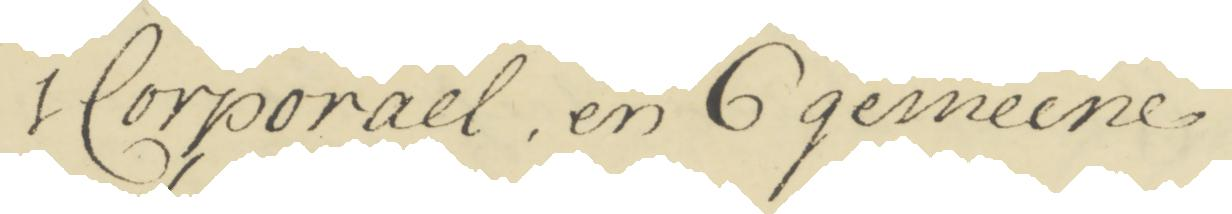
1 Corporael, en 6 gemeene
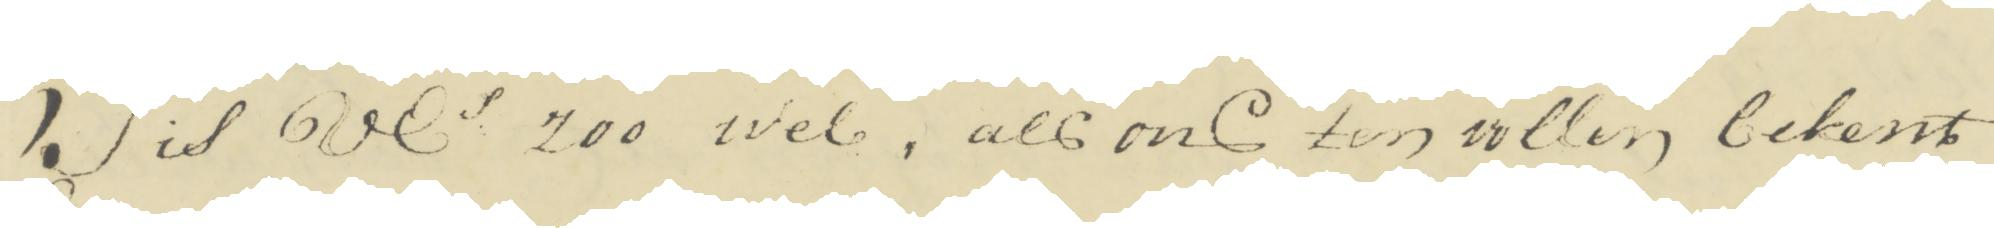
'T is UE:s zoo wel, als ons ten vollen bekent
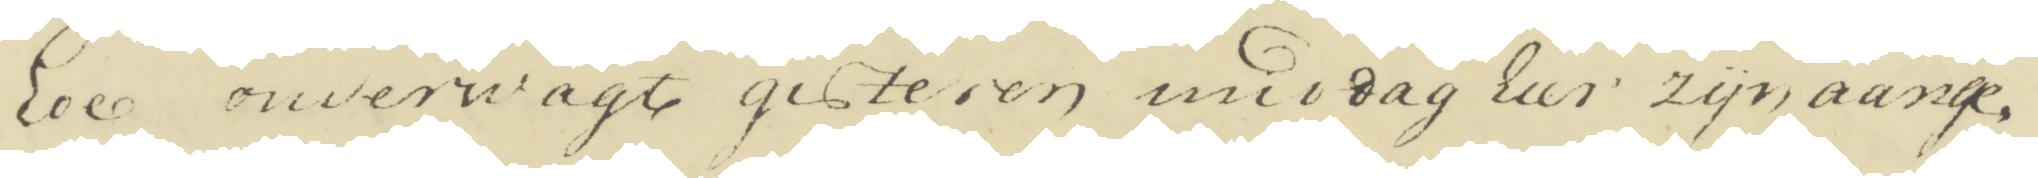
hoe onverwagt gisteren middag hier zijn aange„
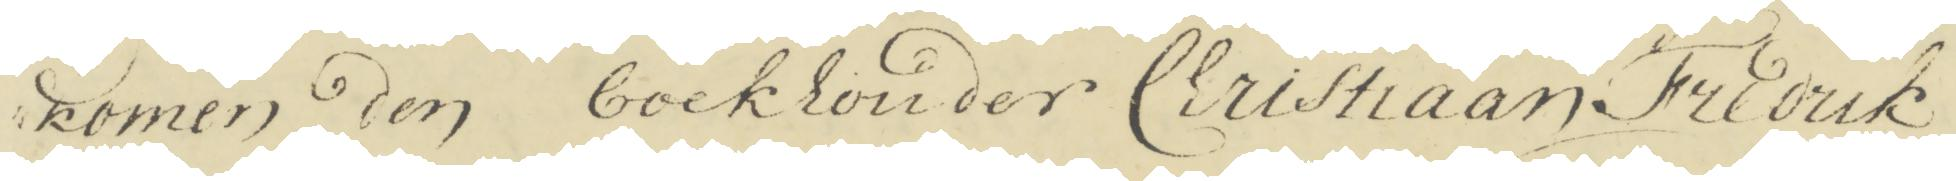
„komen den boekhouder Christiaan Fredrik
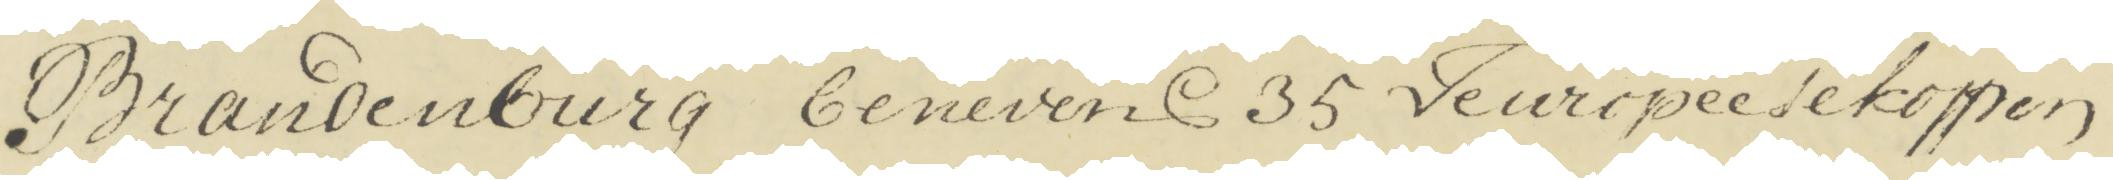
Brandenburg benevens 35 Eeuropeese koppen
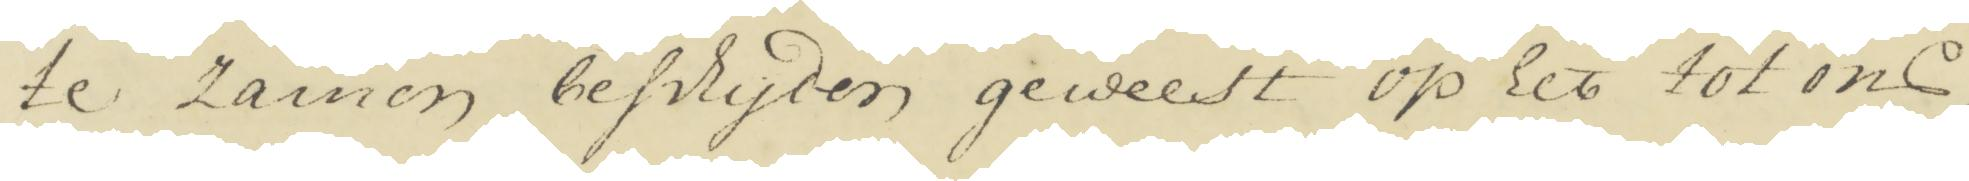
te zamen beschijden geweest op het tot ons
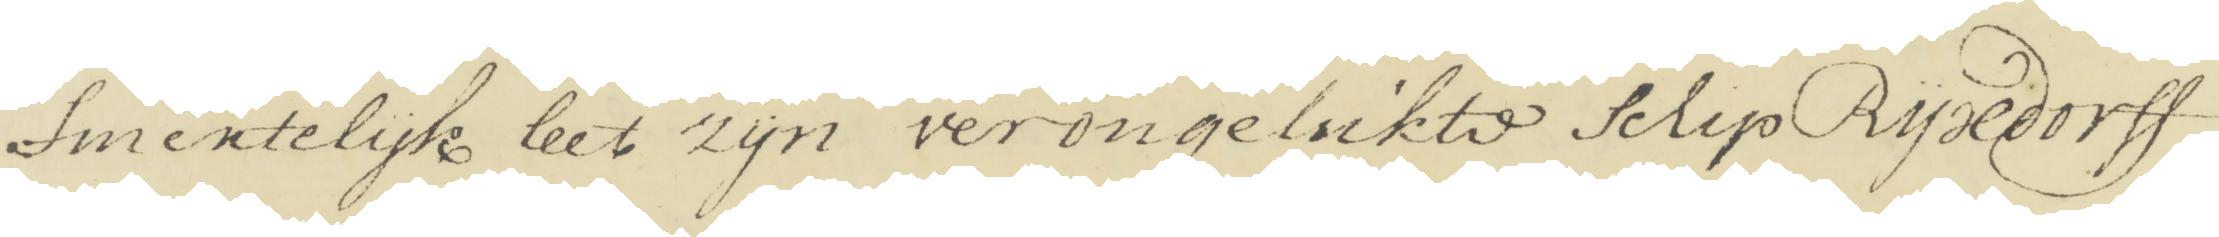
smertelijk leet zijn verongelukte schip Rijxdorff
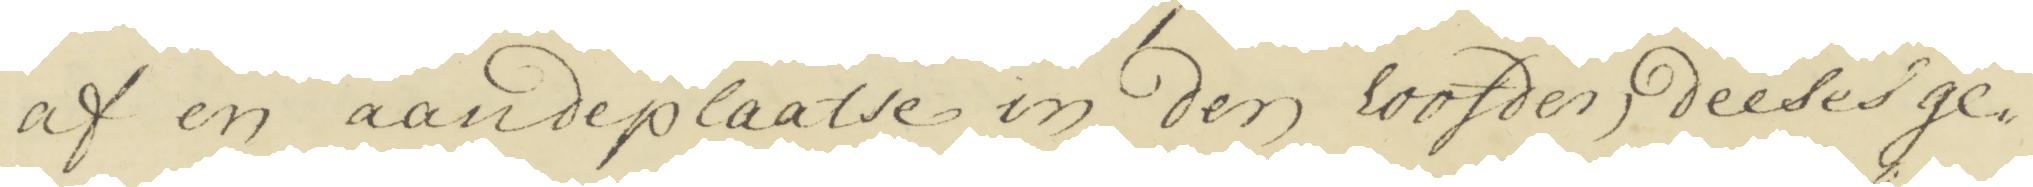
af en aan deplaatse in den hoofden deeses ge„
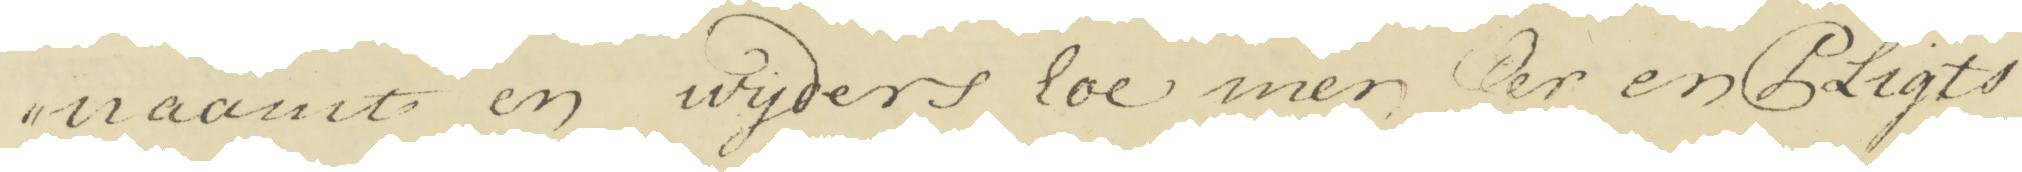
„naamt en wijders hoe men Eer en Pligts
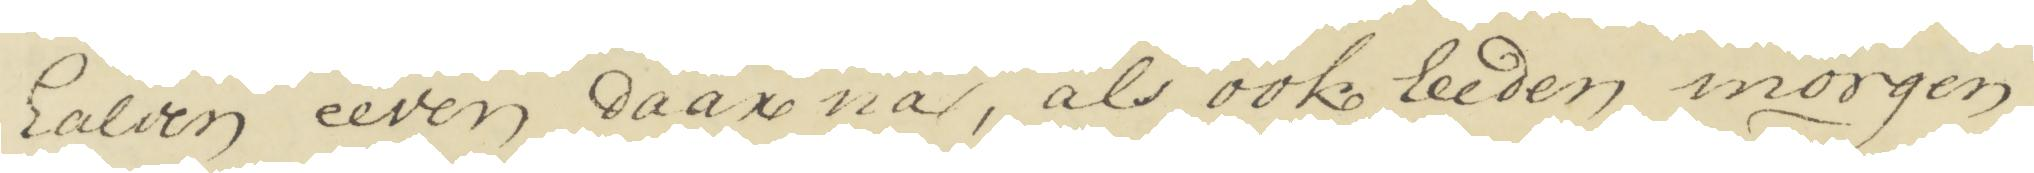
halven eeven daar na, als ook heeden morgen
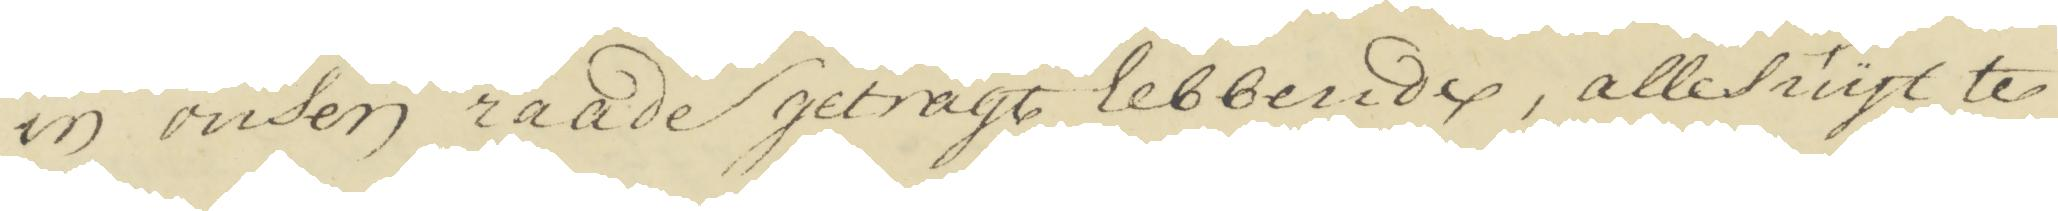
in onsen raade getragt hebbende, alles uijt te
